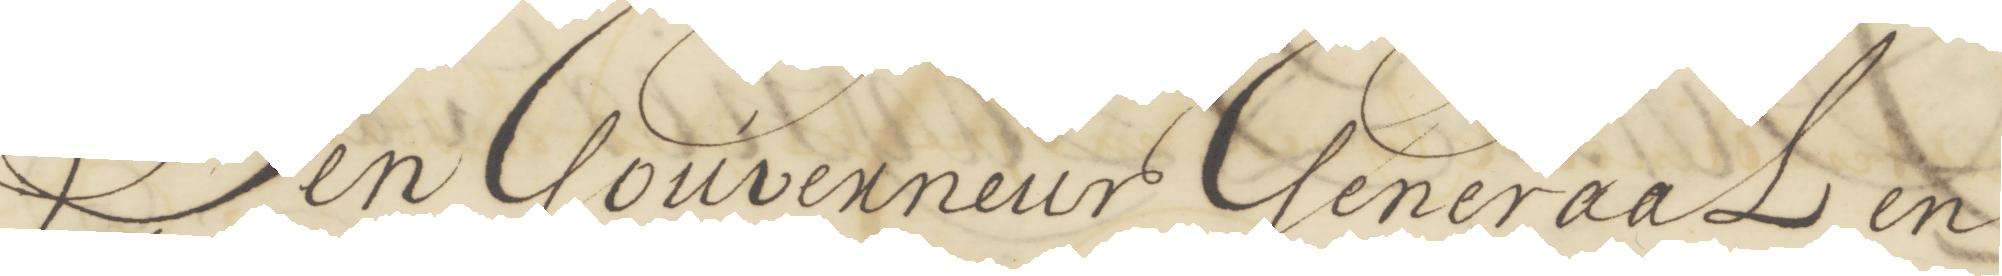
Den Gouverneur Generaal en
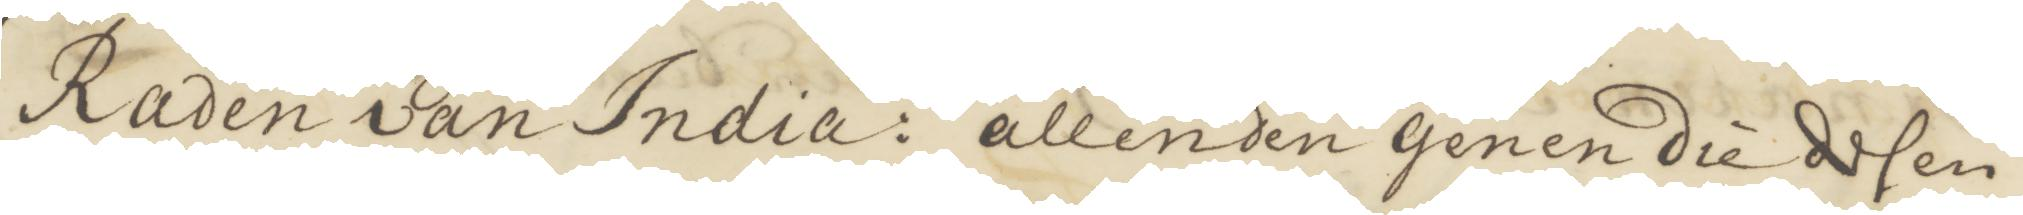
Raden van India: allenden genen die desen
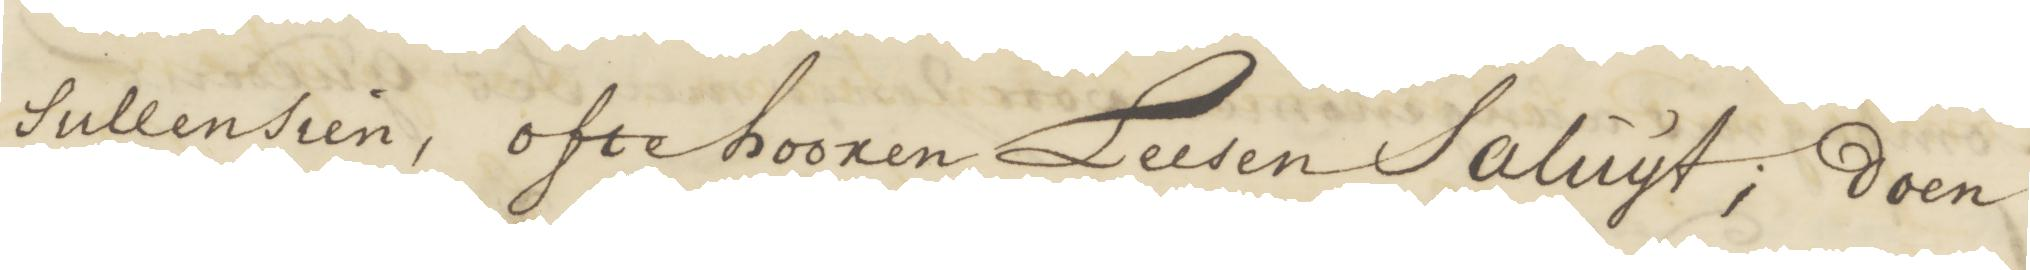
sullen sien, ofte hooren Leesen saluijt; doen
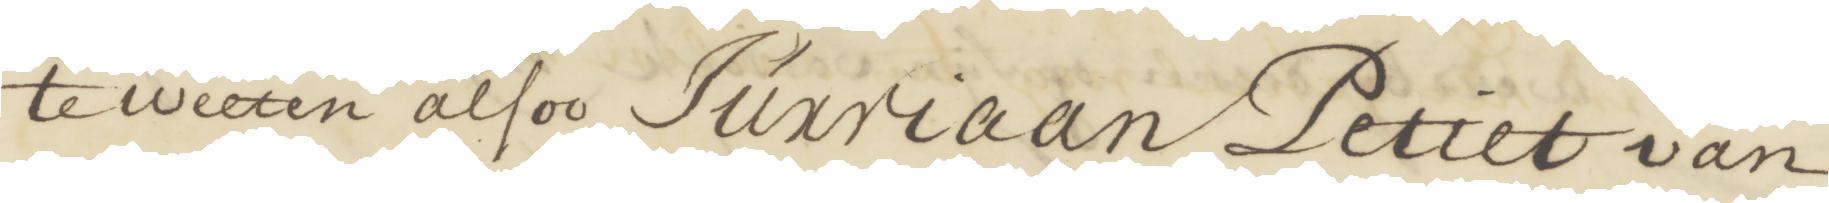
te weeten alsoo Iurriaan Petiet van
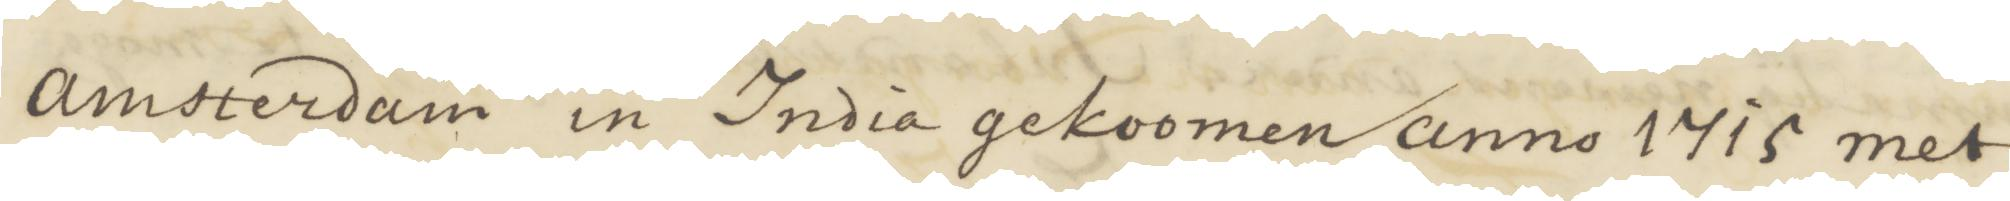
amsterdam in India gekoomen anno 1715 met
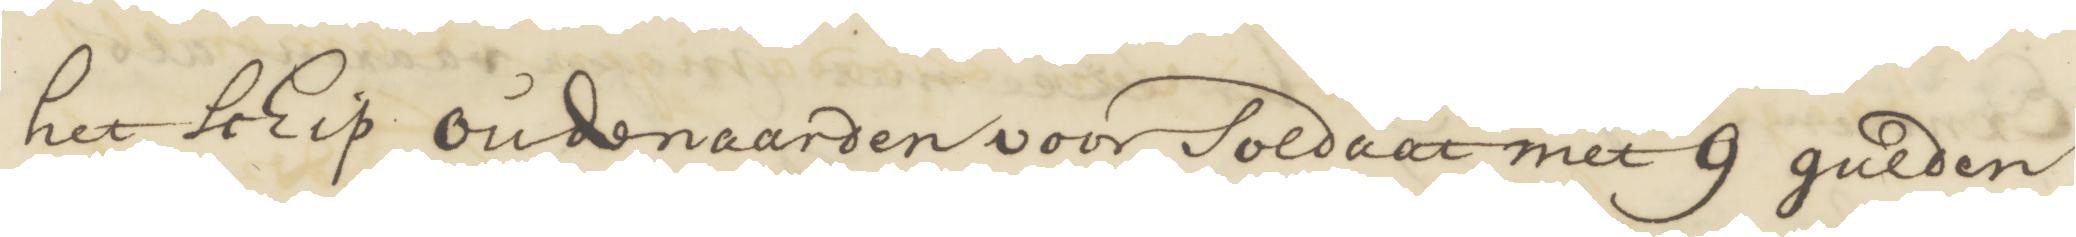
het schip oudenaarden voor soldaat met 9 gulden
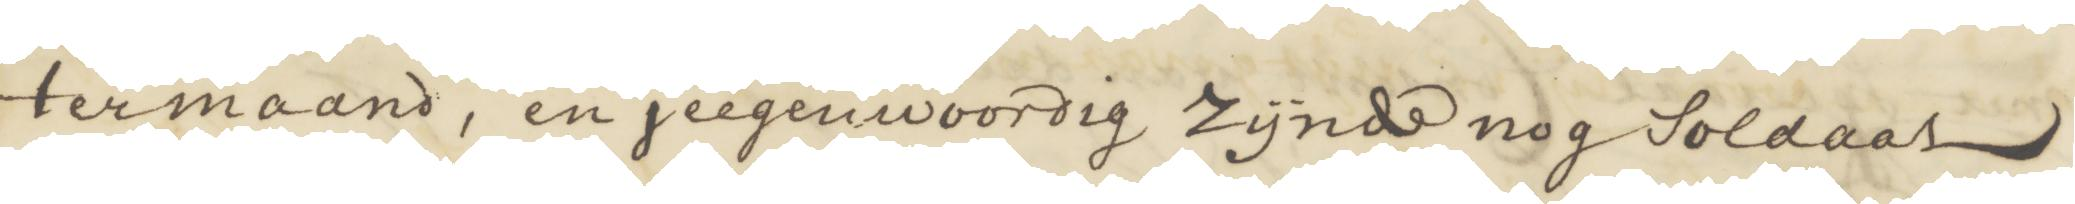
ter maand, en jeegenwoordig zijnde nog soldaat
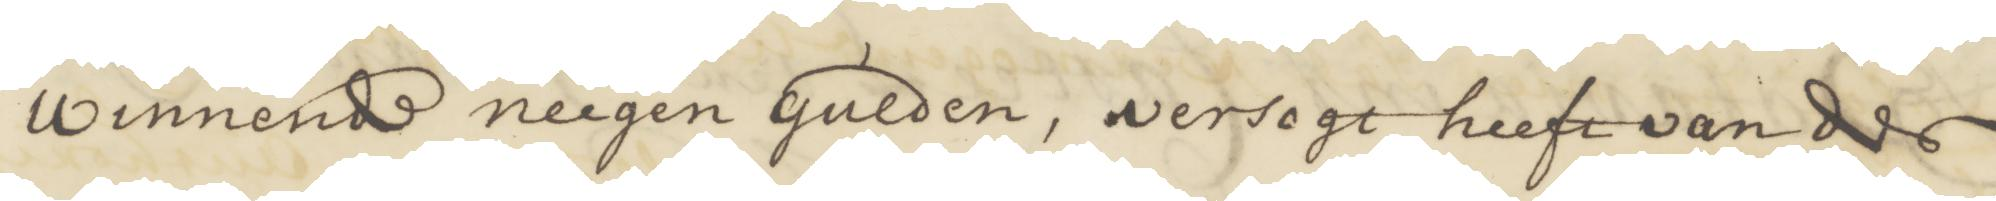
winnende neegen gulden, versogt heeft van des
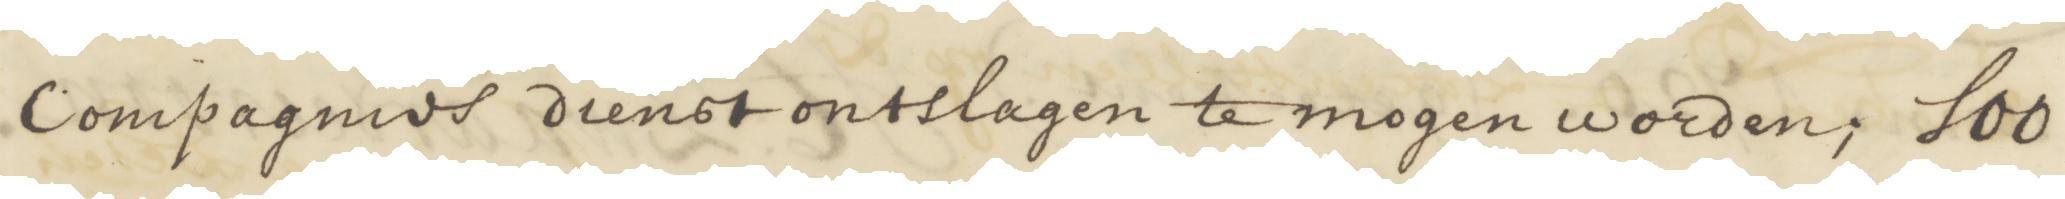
Compagnies dienst ontslagen te mogen worden; soo
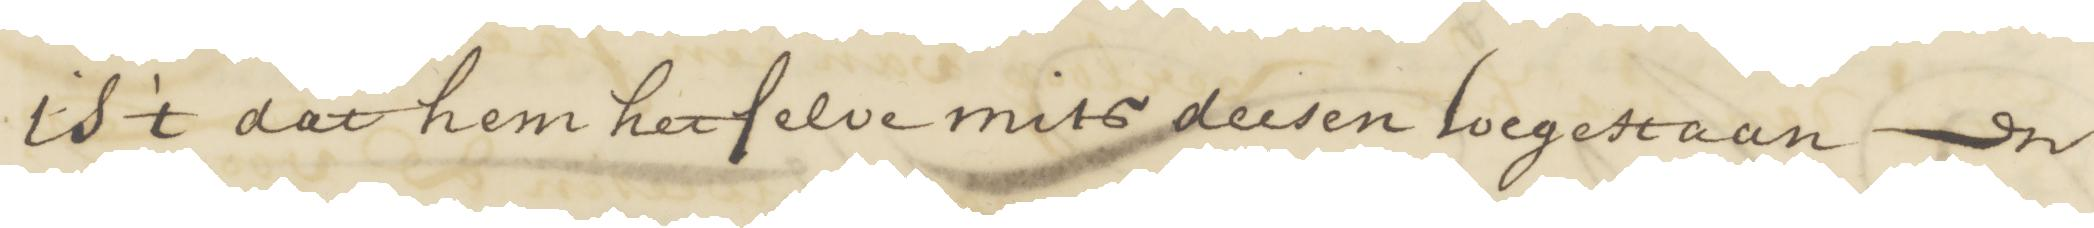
is ’t dat hem hetselve mits deesen toegestaan en
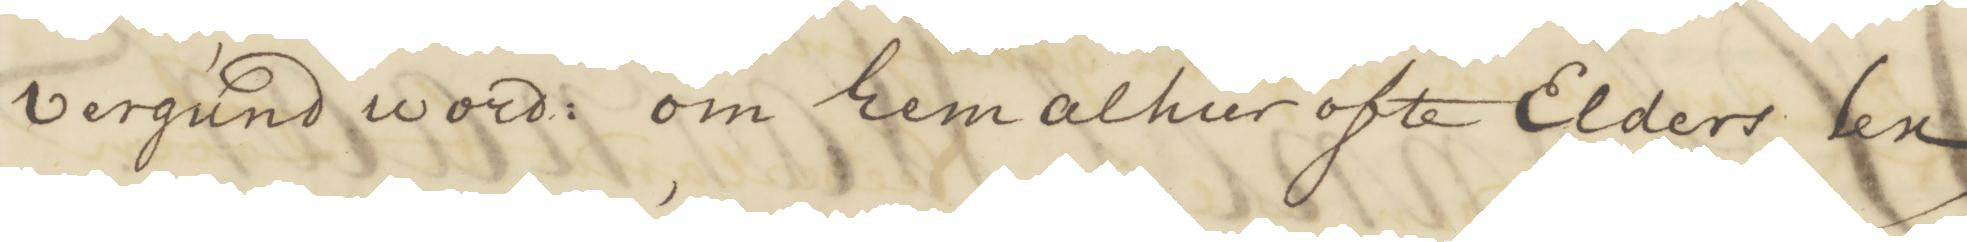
vergund word: om hem alhier ofte Elders ter
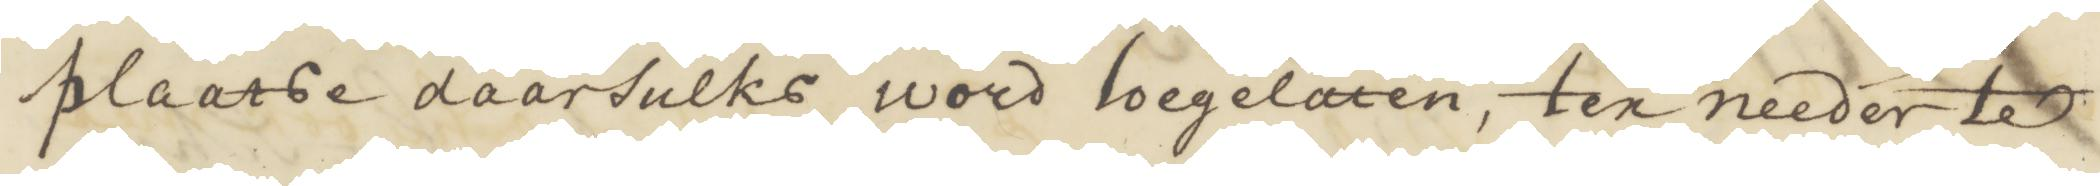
plaatse daarsulks word toegelaten, ter needer te
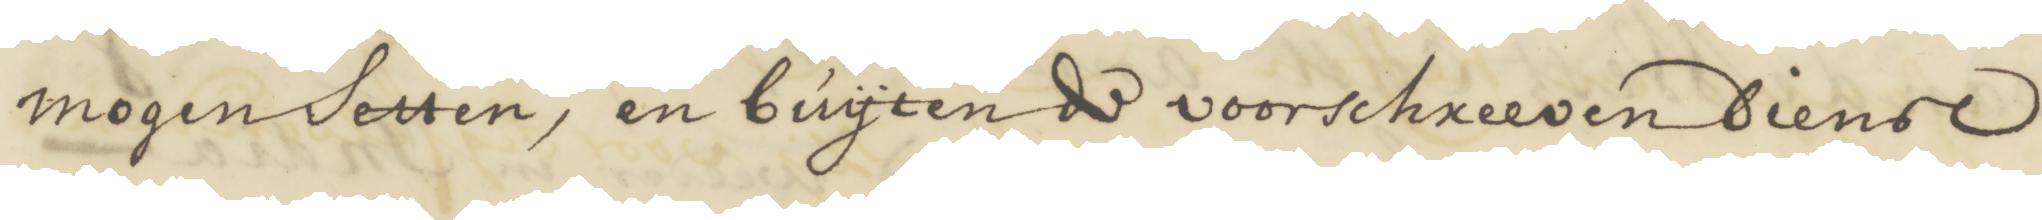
mogen setten, en buijten de voorschreeven dienst
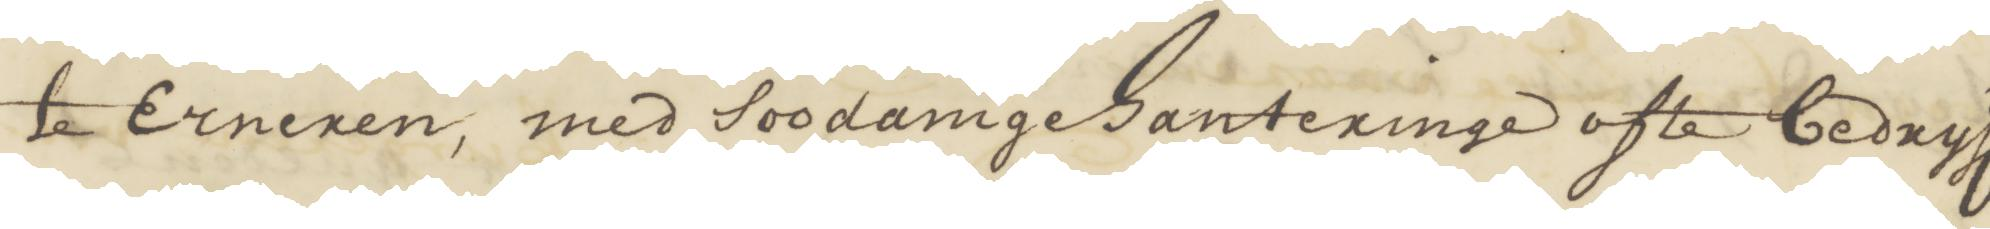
te Erneren, med soodanige hanteringe ofte bedrijff
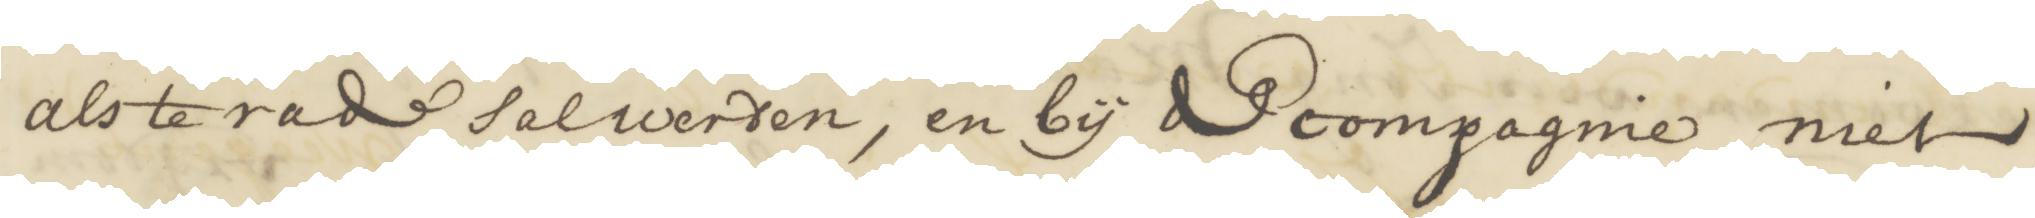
als te rade sal werden, en bij de compagnie niet
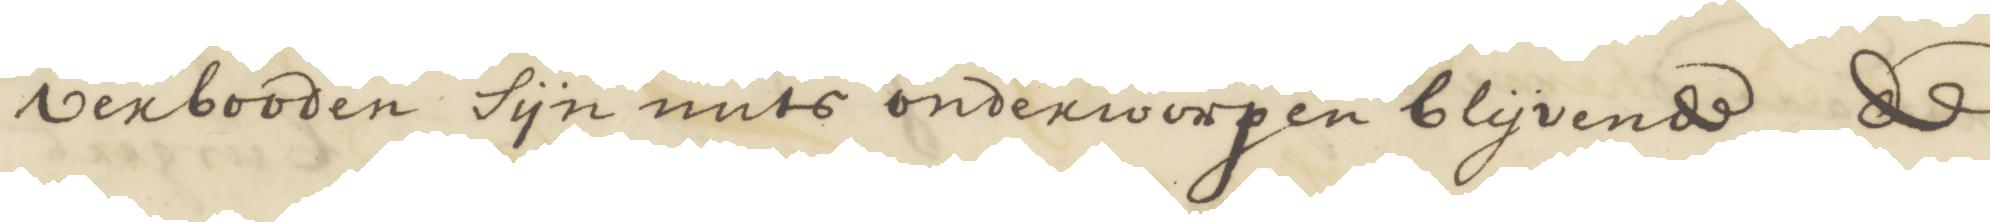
verbooden sijn mits onderworpen blijvende de
